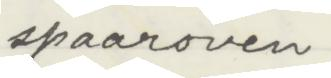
spaaroven
